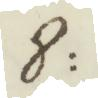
8:
